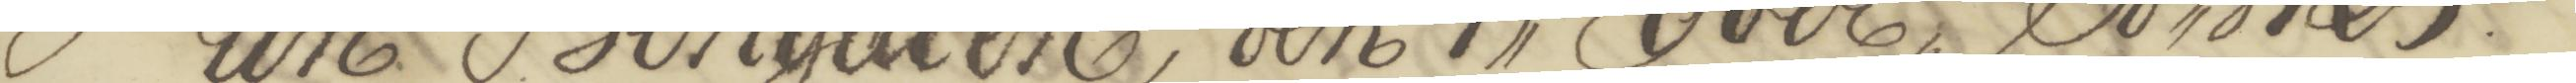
Van Bengalen, den 7„e 8ber„ A„o 1725:
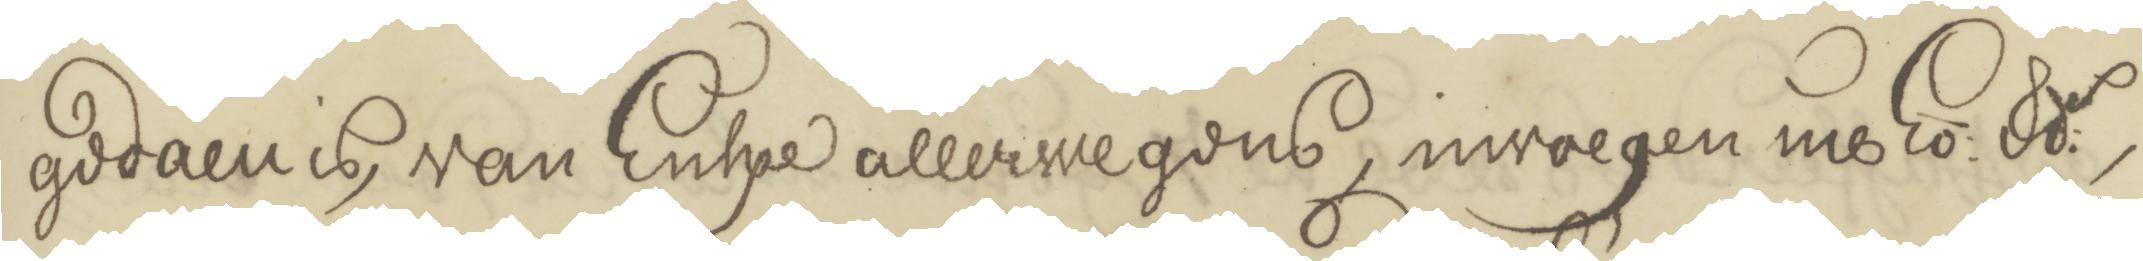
gedaen is, van hulpe allerwegens, invoegen uw ho: Ed:s,
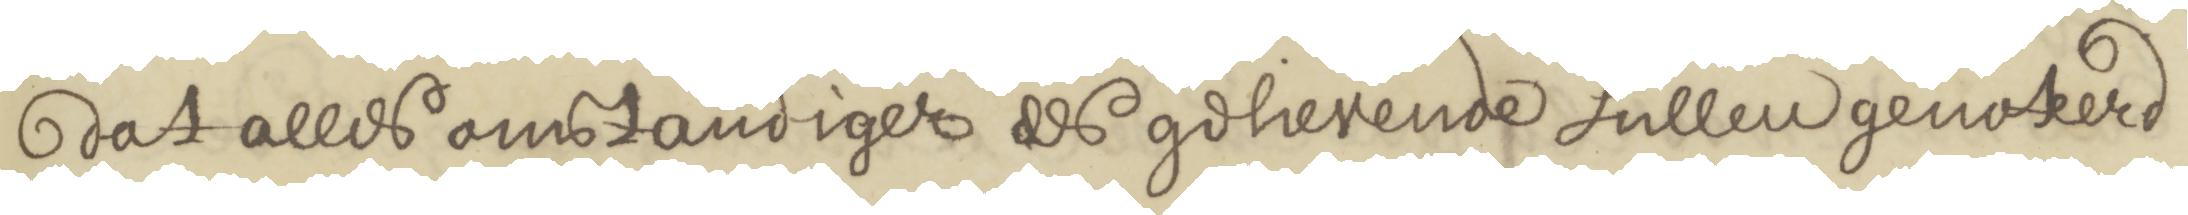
dat alles omstandiger des gelievende sullen genoteerd
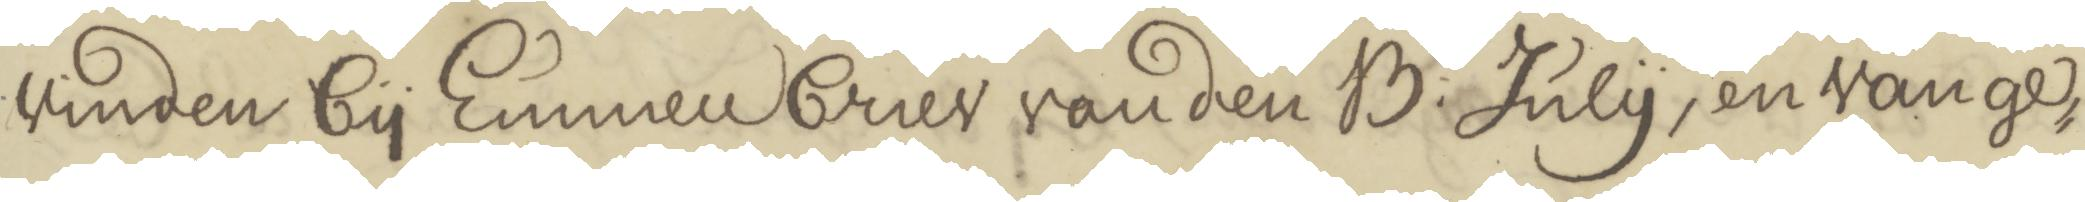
vinden bij hunnen briev van den 13:' Julij, en van ge„
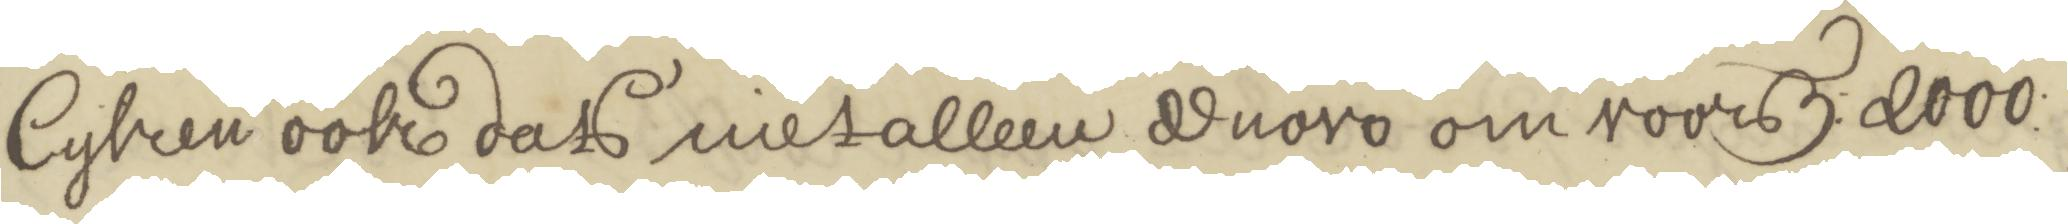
lyken ook dat niet alleen de novo om voors: 2000:
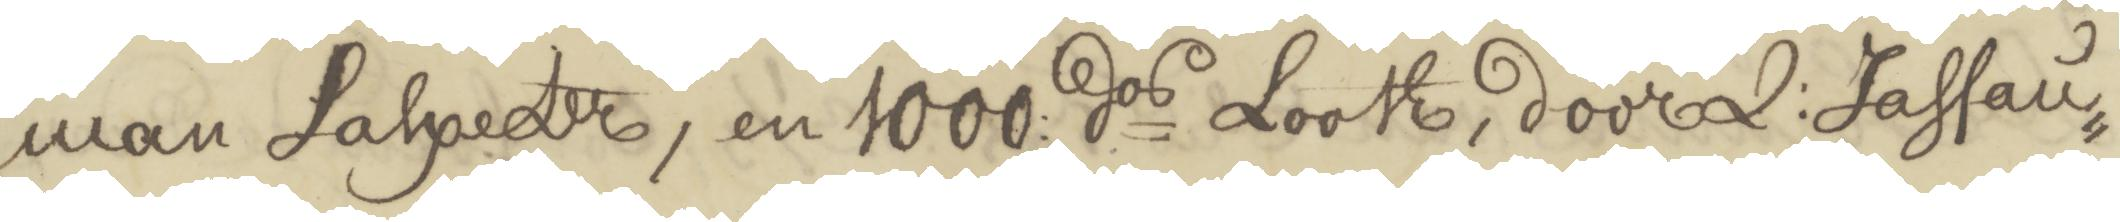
man salpeter, en 1000: d=os Looth, door 2: Iassau„
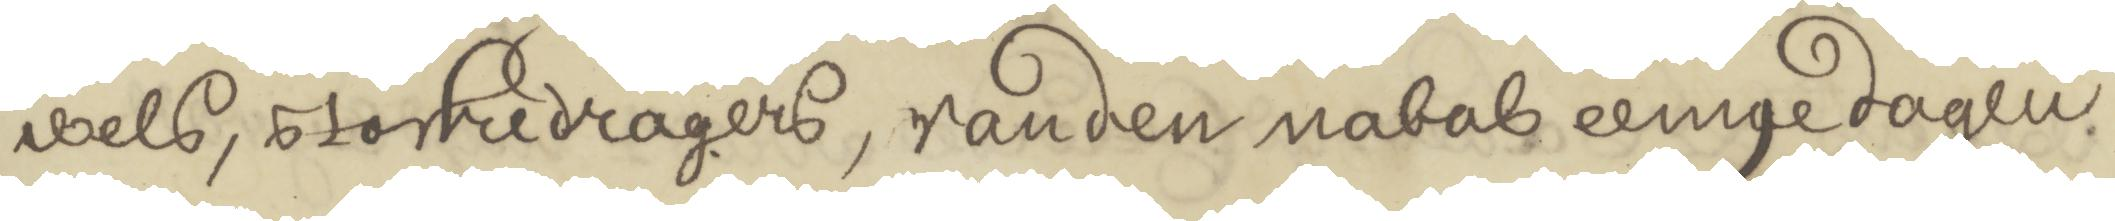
wels, storkedragers, van den nabab eenige dagen
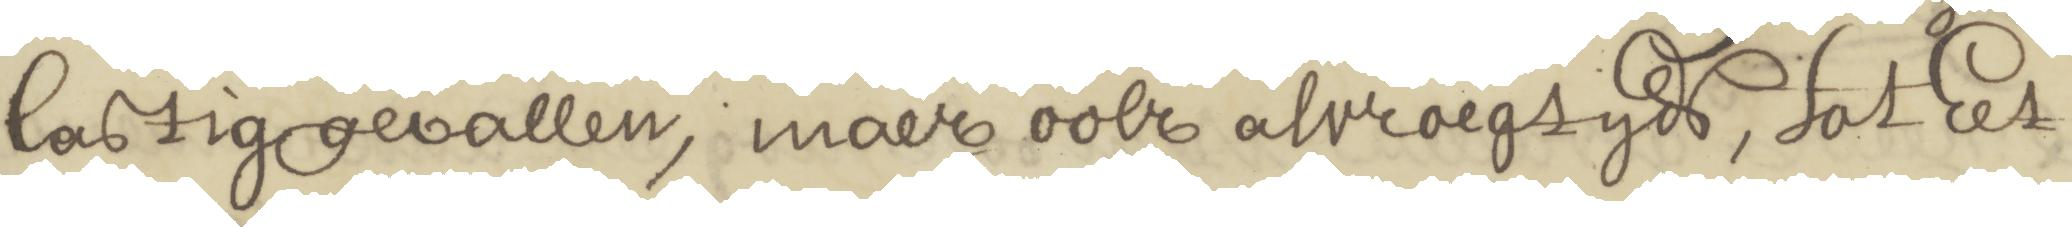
lastig gevallen, maer ook alvroegtijds, tot het
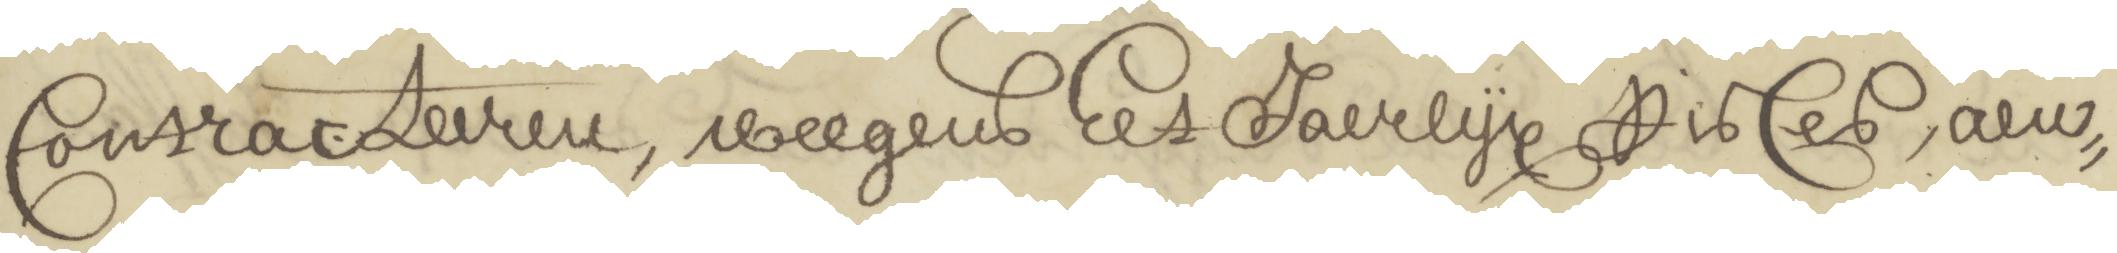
Contracteeren, weegens het Iaerlijx Pisces, alw„
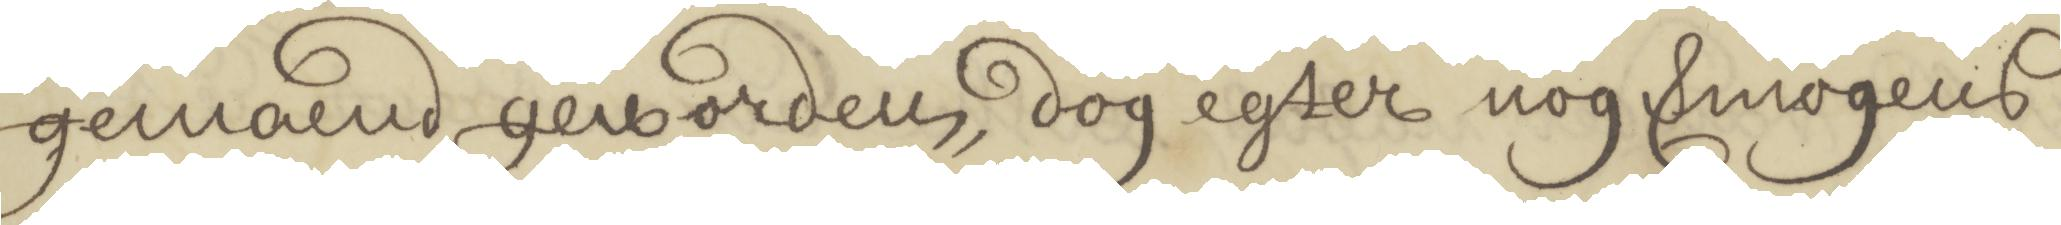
gemaend geworden, dog egter nog vermogens
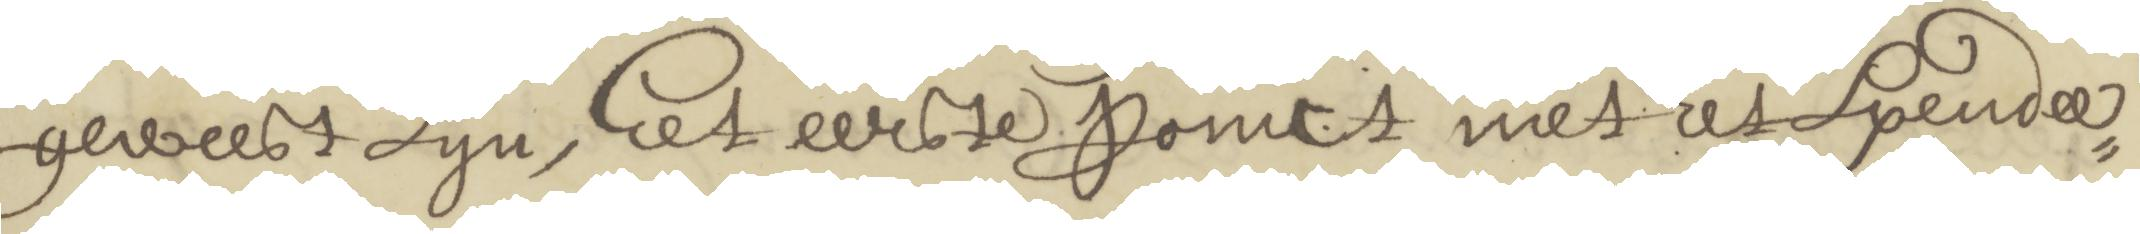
geweest sijn, het eerste Poinct met het spendee„
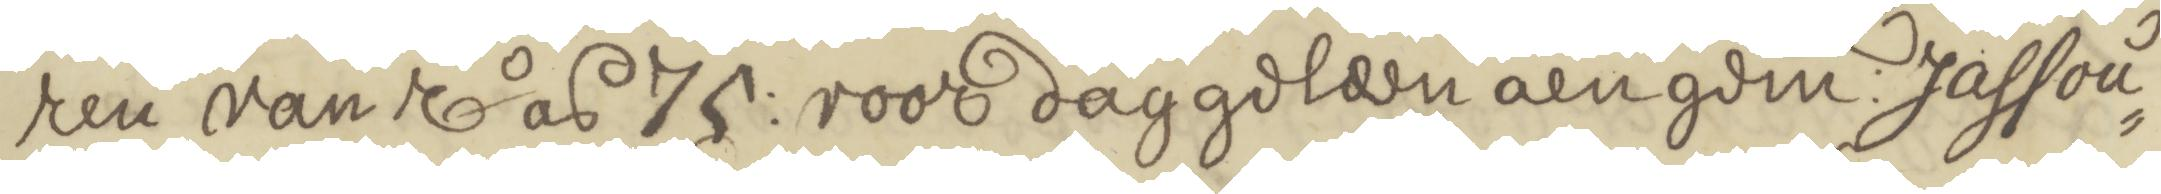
ren van r/oas 75: voor dag gelden aen gem: Jassou„
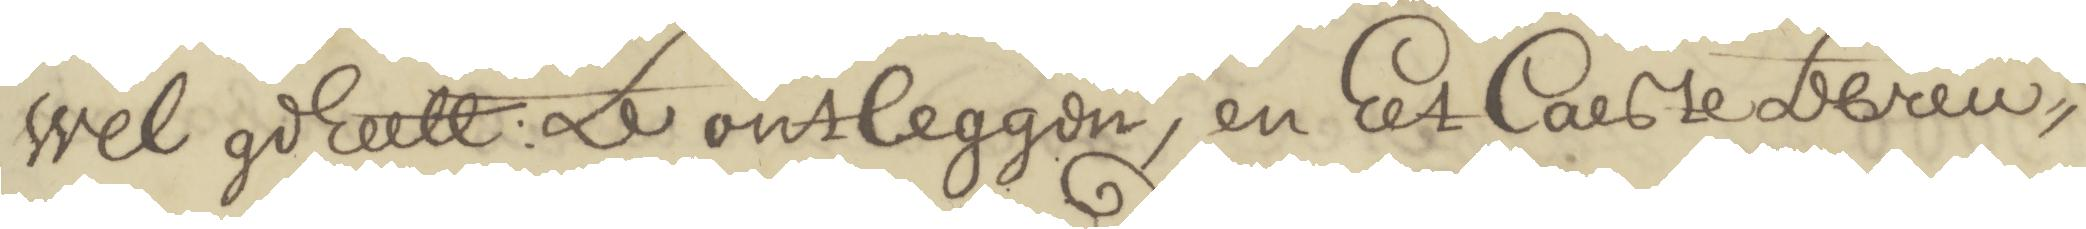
wel geheell: te ontleggen, en het Caeste tebren„
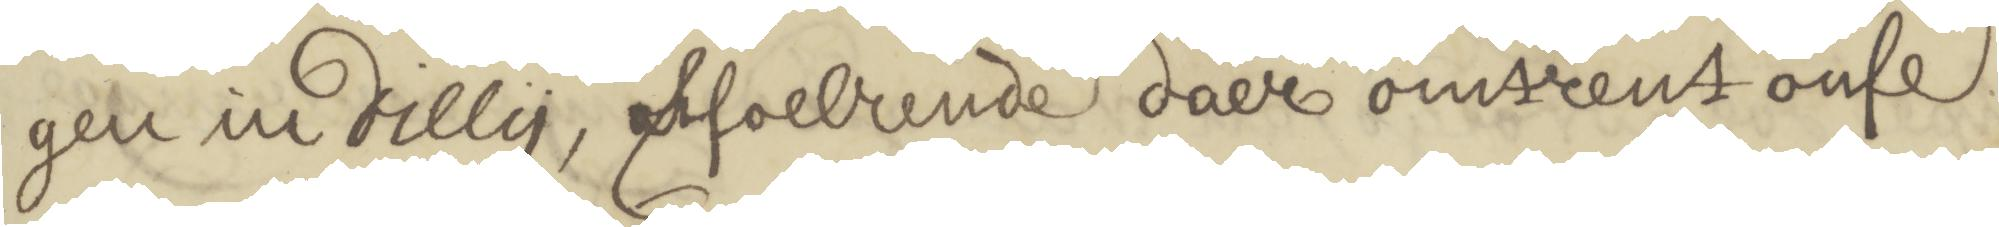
gen in dillij, versoekende daer omtrent onse
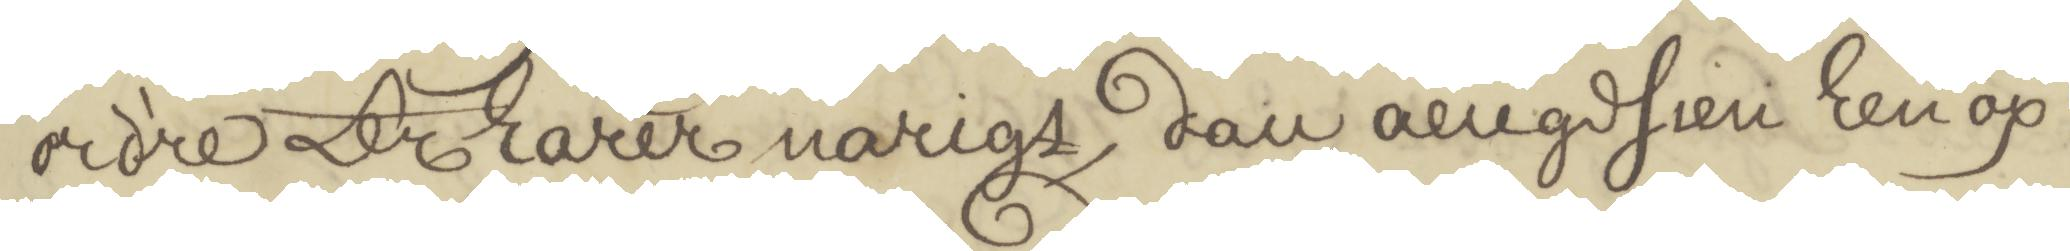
ord're ter harer narigt, dan aengesien hen op
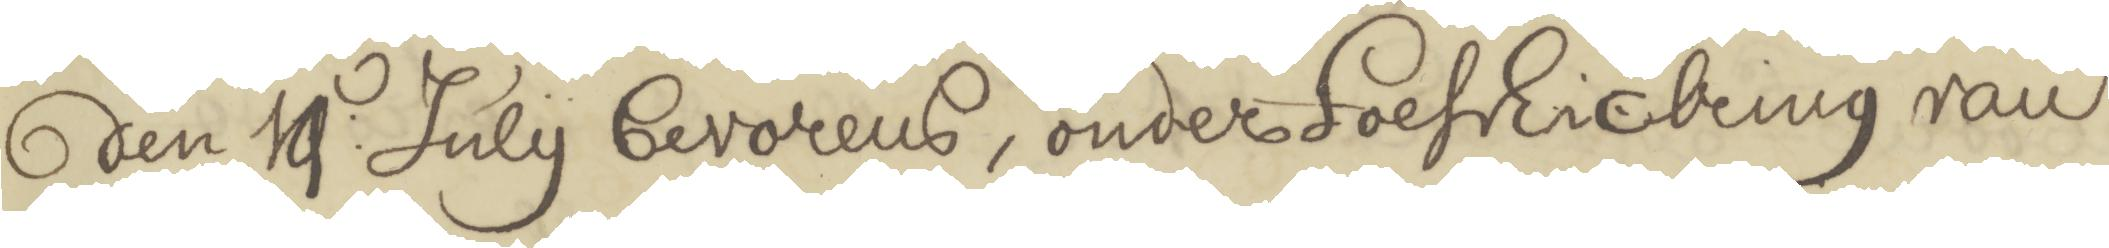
den 14:' Julij bevorens, onder toeschicking van
